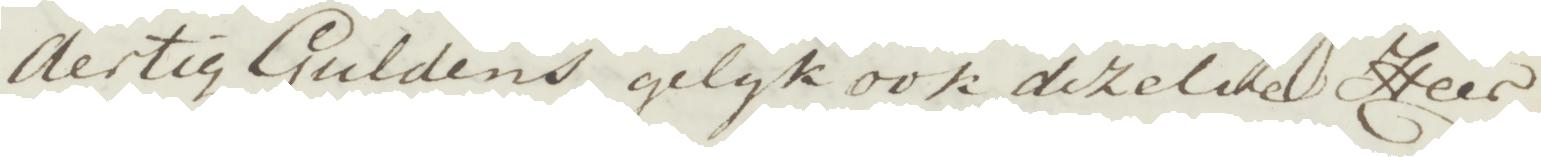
dertig Guldens, gelyk ook dezelve Heer
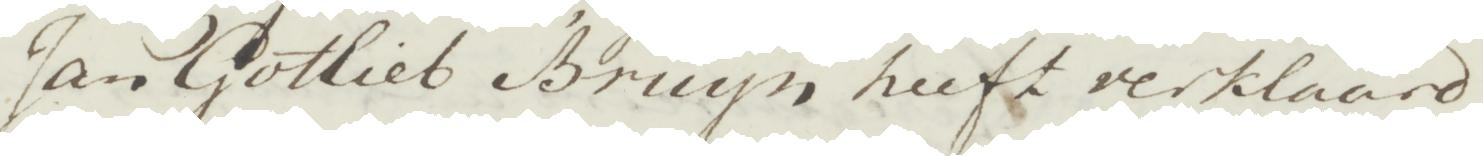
Jan Gotlieb Bruyn heeft verklaard
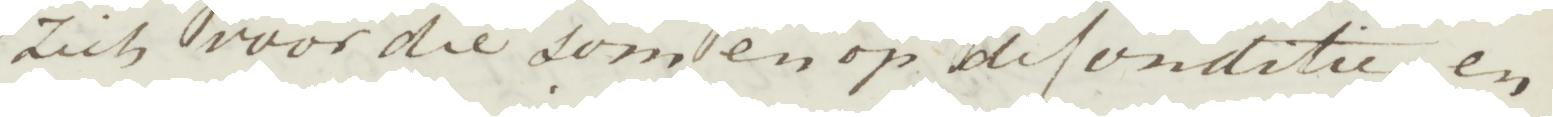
zich voor die som en op Conditien en
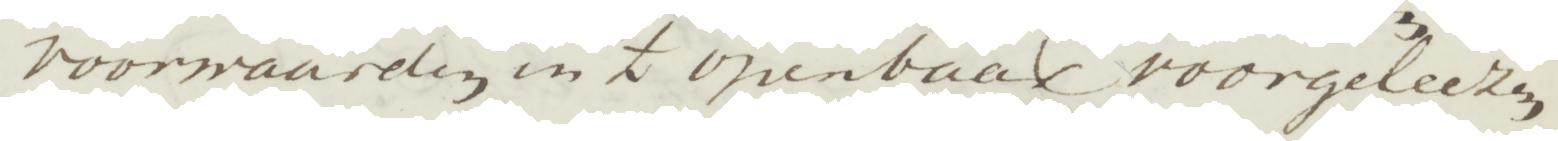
voorwaarden in 't openbaar voorgeleezen
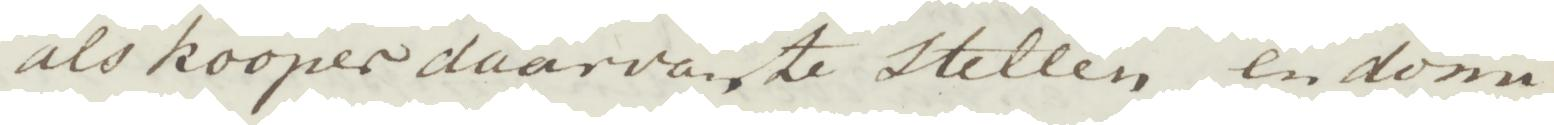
als kooper daarvan te stellen en domi
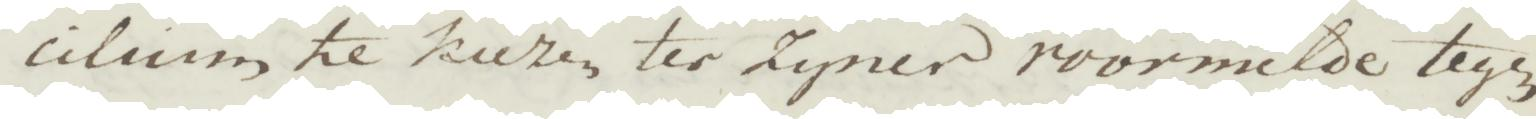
cilium te kiezen ter zyner voormelde tegen
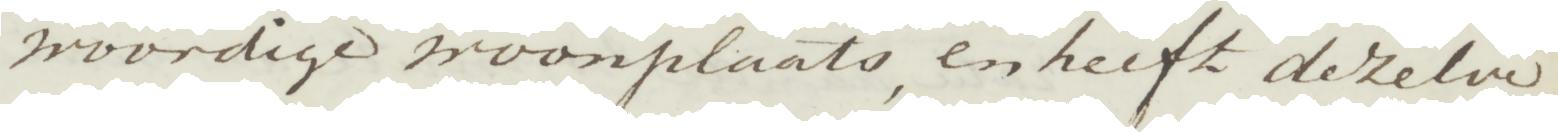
woordige woonplaats, en heeft dezelve
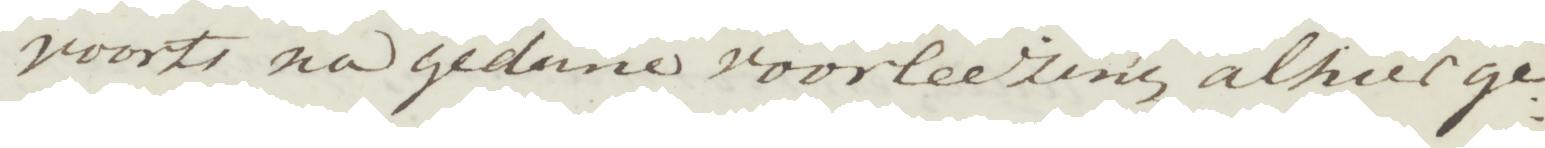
voorts na gedane voorleezing alhier ge=
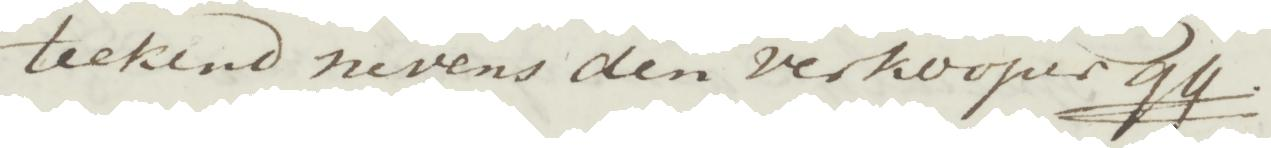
=teekend nevens den verkooper qq.
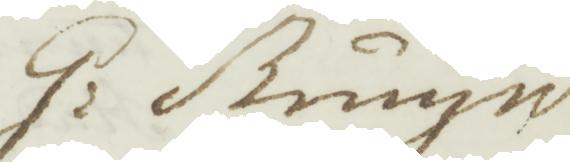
J: G: Bruijn
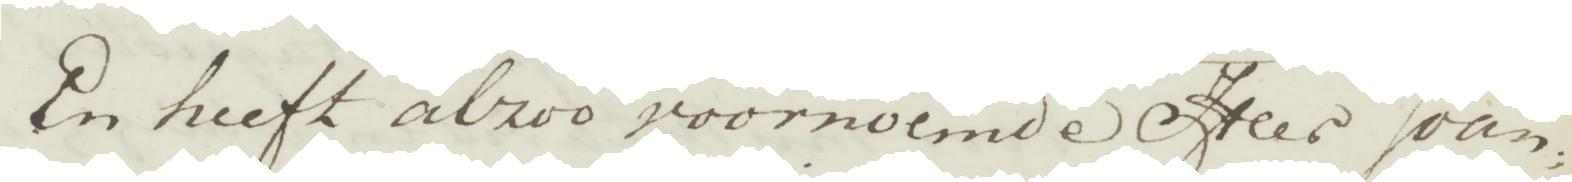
En heeft alzoo voornoemde Heer Joann:
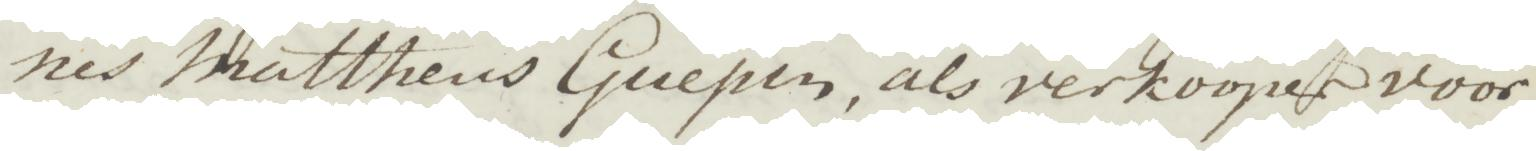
nes Mattheus Guepin, als verkooper voor
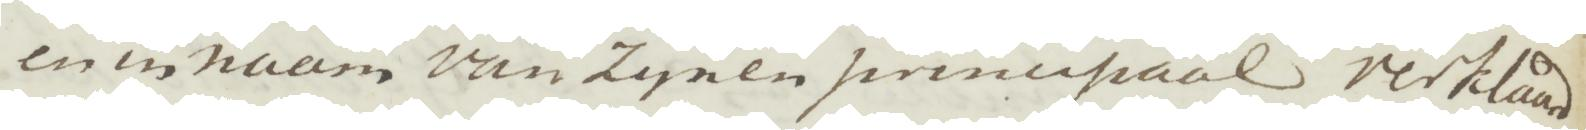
en in naam van zynen principaal verklaard
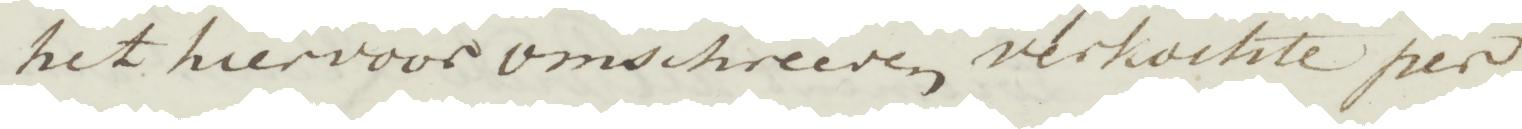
het hiervoor omschreeven verkochte per
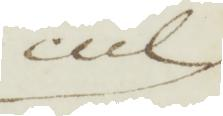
=ceel
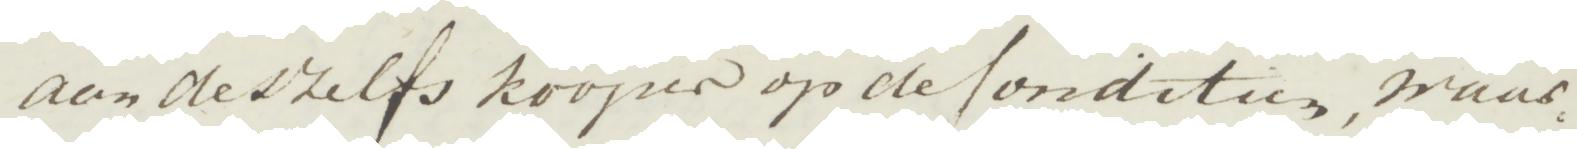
aan deszelfs kooper op de conditien, waar„
